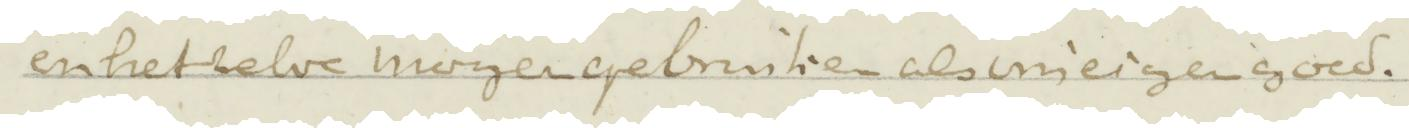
en het zelve mogen gebruiken als om eigen goed
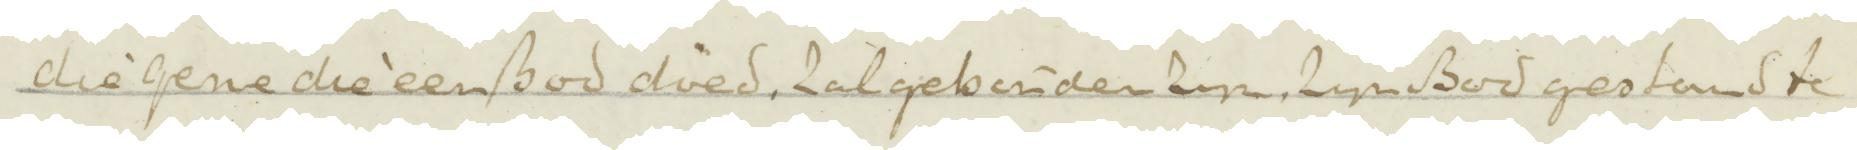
die gene die een Bod doed, zal gebonden zyn, zyn Bod gestand te
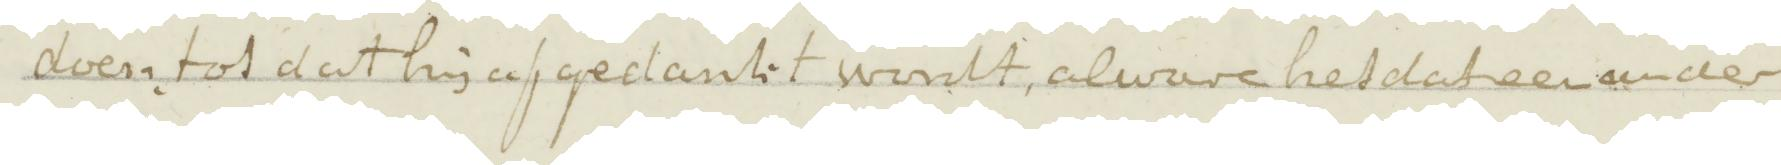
doen, tot dat hij afgedankt wordt, alware het dat een ander
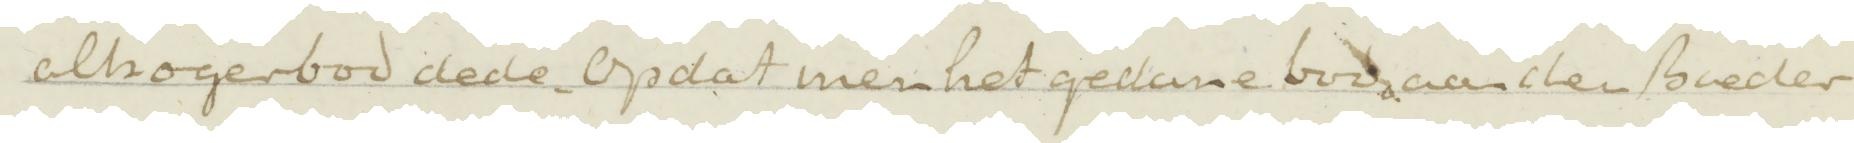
al hogerbod dede, opdat men het gedane bod den Bieder
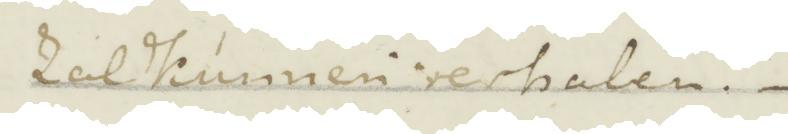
zal kunnen verhalen.
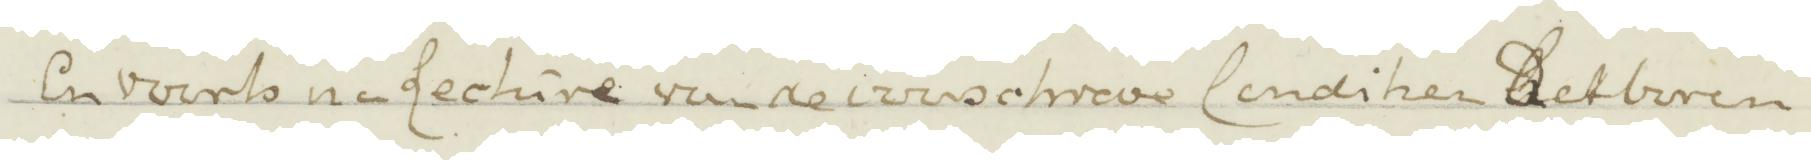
En voorts na Lecture van de voorschreve Conditien het boven
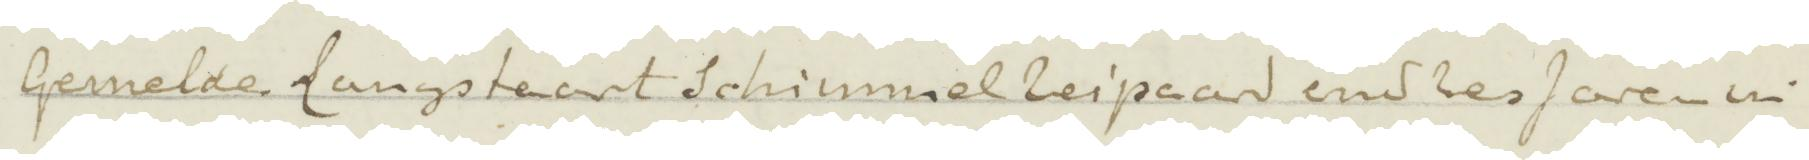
Gemelde Langstaart schimmel Reipaard oud zes Jaren in
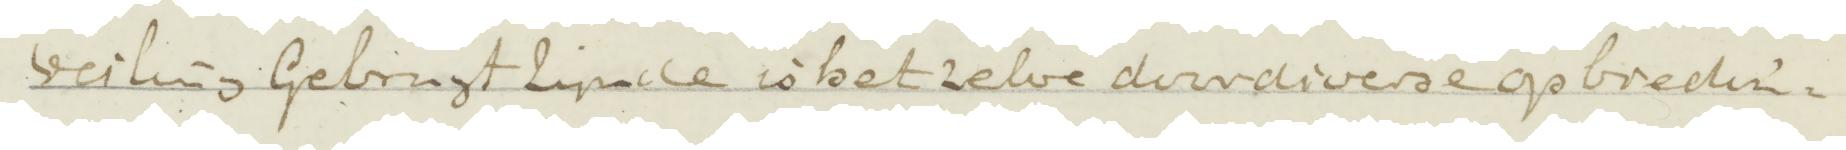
veiling gebragt zijnde is het zelve door diverse opbiedin„
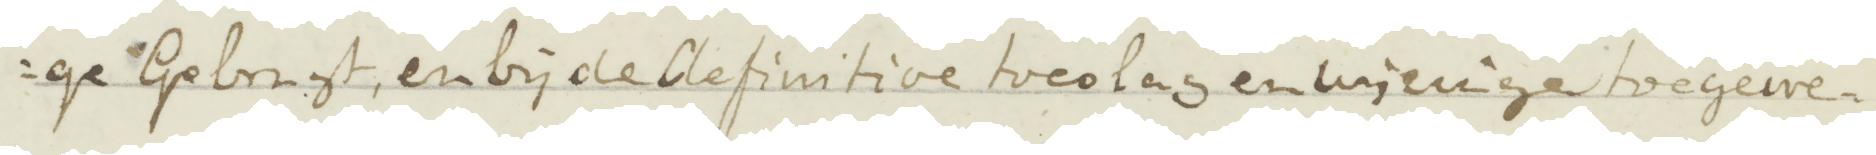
=ge Gebragt, en bij de definitive toeslag en wijzinge toegewe„
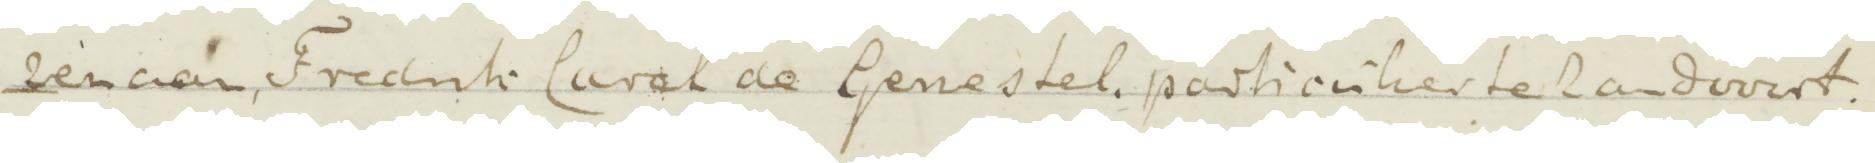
zen aan, Fredrik Carel de Genestel. particulier te Zandvoort.
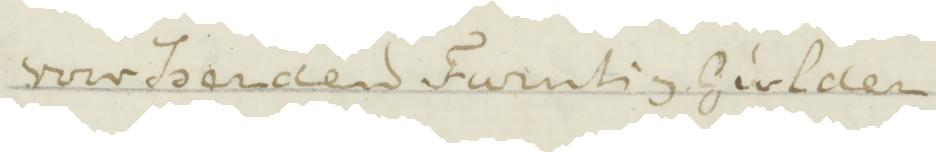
voor honderd Twintig Gulden
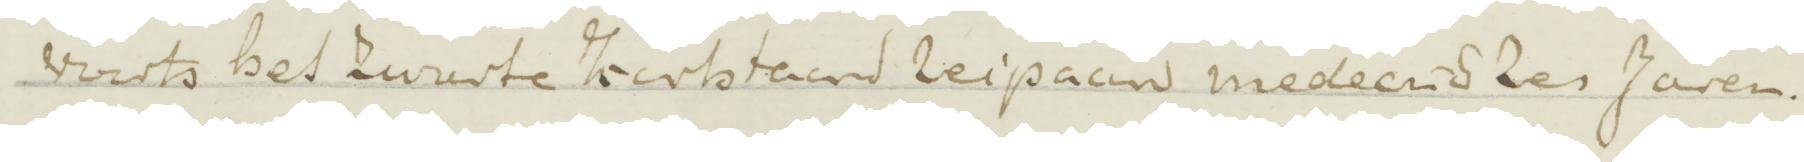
voorts het Zwarte kortstaart Reipaard mede oud Zes Jaren
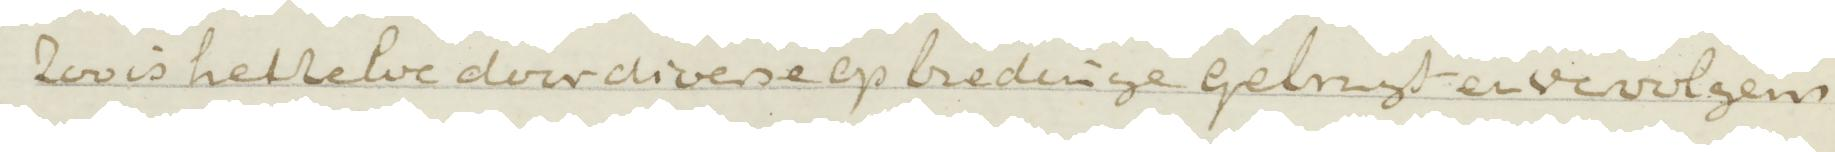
zoo is hetzelve door diverse op biedingen gebragt en vervolgens
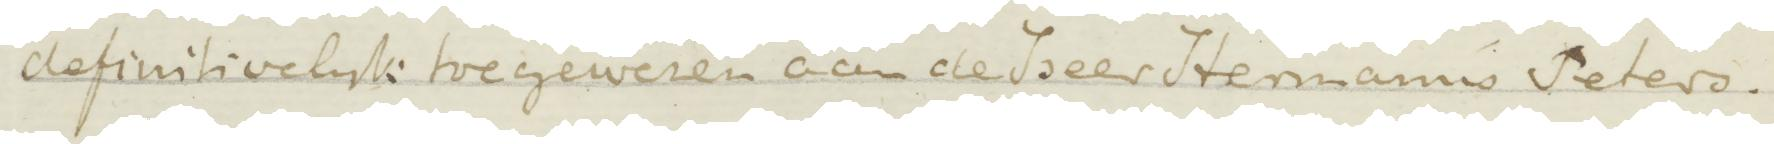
definitivelyk toegewezen aan de Heer Hermanus Peters.
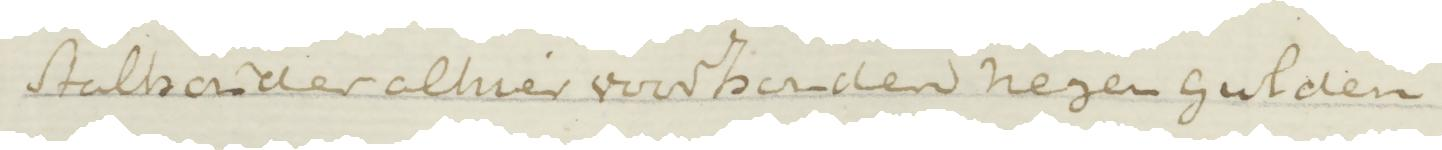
Stalhouder alhier voor honderd negen gulden
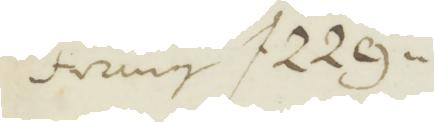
Transp ƒ229„
